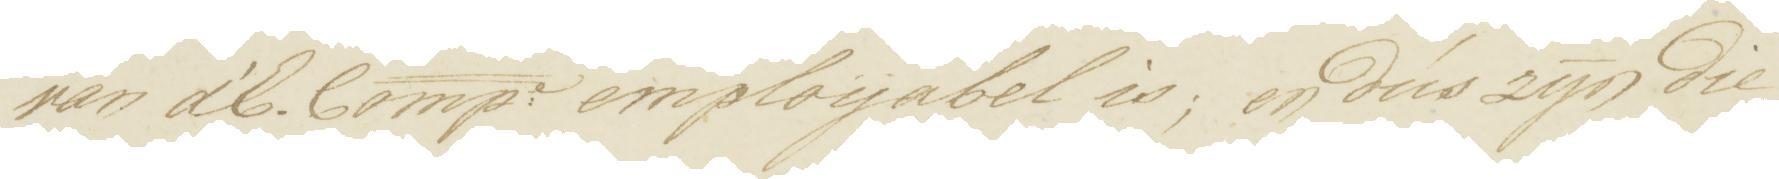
van d'E. Comp:e emploijabel is; en dus zijn die
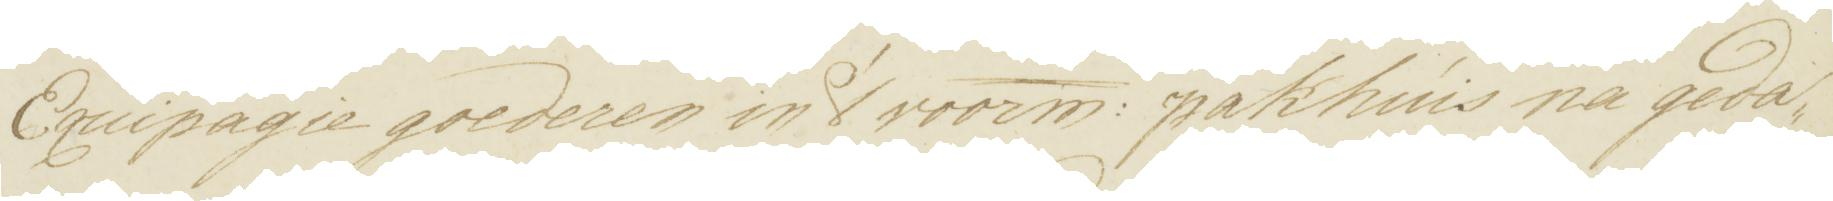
Equipagie goederen in ’t voorm: pakhuis na geda„
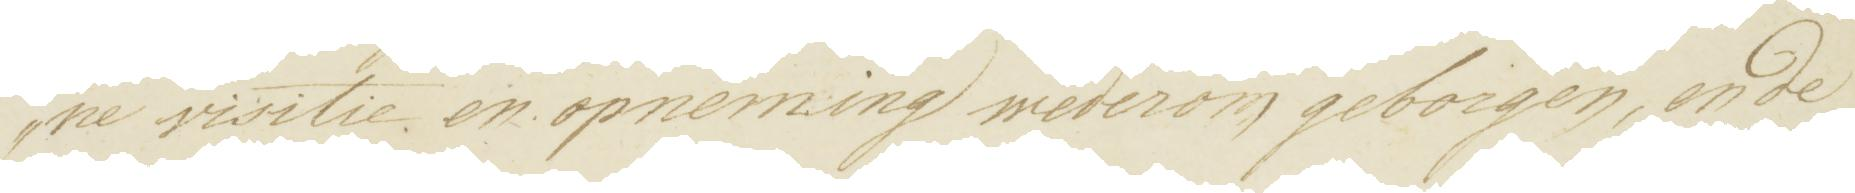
ne visitie en opneming wederom geborgen, ende
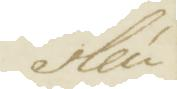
Heu
